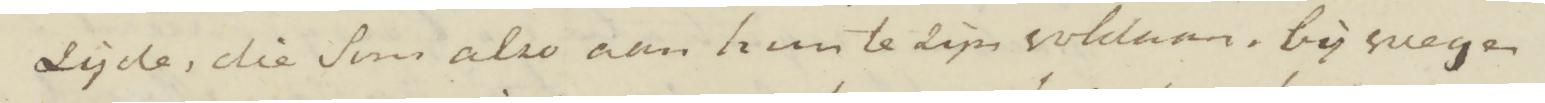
zijde, die Som alzo aan hun te zijn voldaan, bij wegen
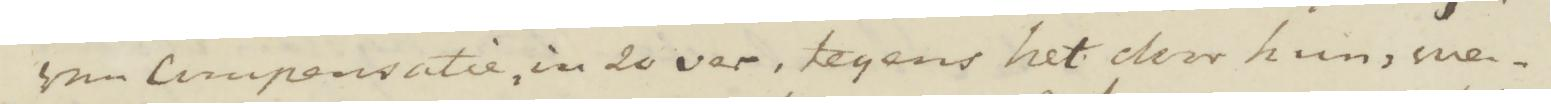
van compensatie, in zo ver, tegens het door hun, we-
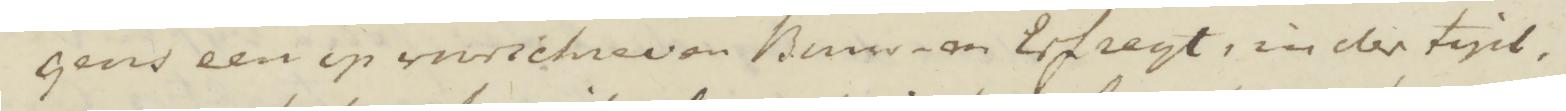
gens een op voorschreven Bouw - en Erfregt, in der tijd,
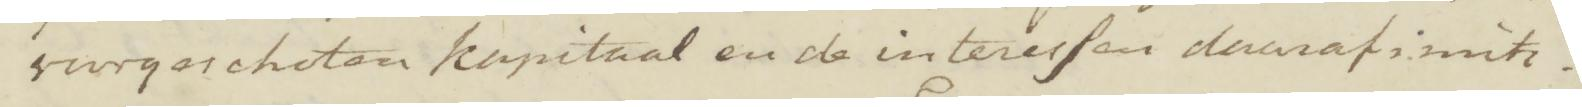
voorgeschoten kapitaal en de interessen daaraf, mits-
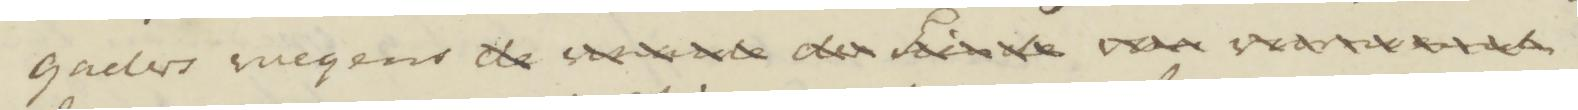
gaders wegens de waarde der huise van voormelde
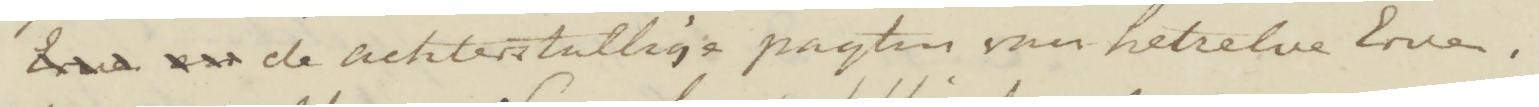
Erve en de achterstallige pagten van hetzelve Erve,
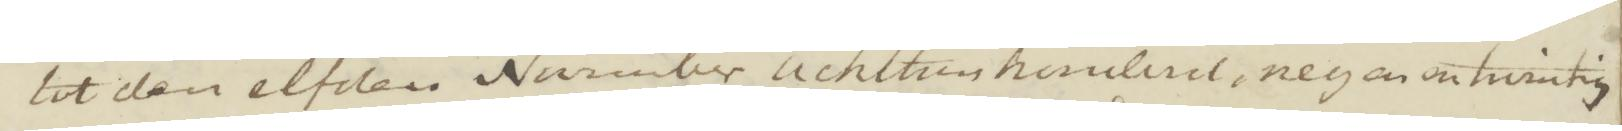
tot den elfden November Achttienhonderd, negen en twintig
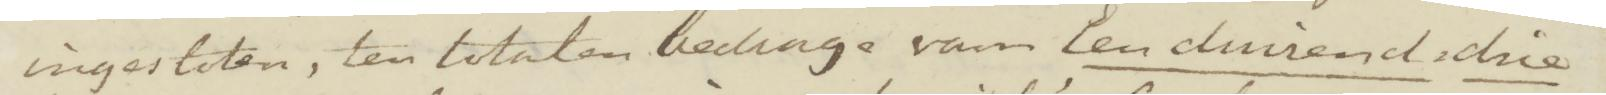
ingesloten, ten totalen bedrage van Een duizende drie
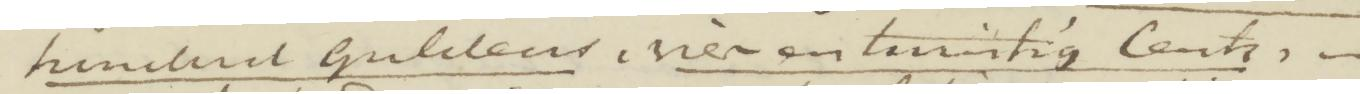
honderd Guldens, vier en twintig Cents—
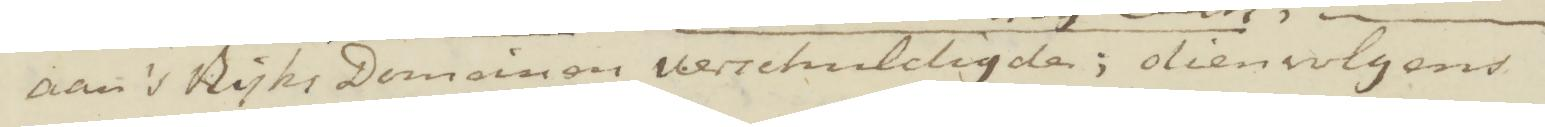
aan 's Rijks Domeinen verschuldigde; dienvolgens
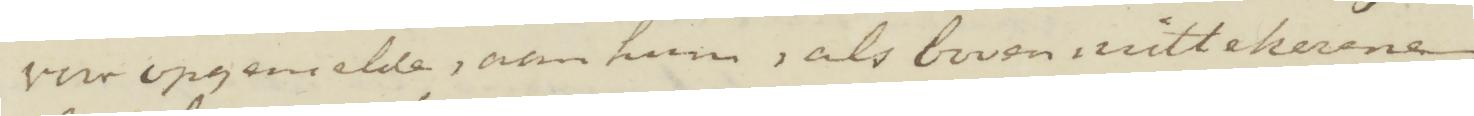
voor opgemelde, aan hun, als boven, uittekerene
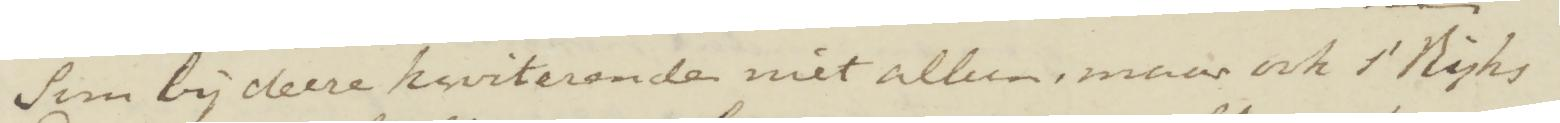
Som bij deeze kwiterende niet alleen, maar ook s' Rijks
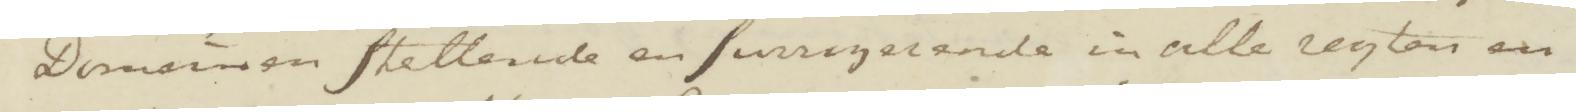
Domeinen stellende en surrogerende in alle regten en
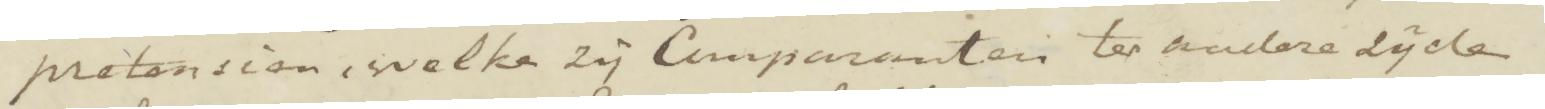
pretensien, welke zij Comparanten ter andere zijde
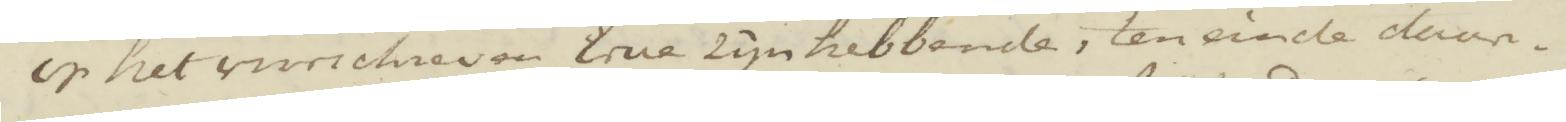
op het voorschreven Erve zijn hebbende, ten einde daar-
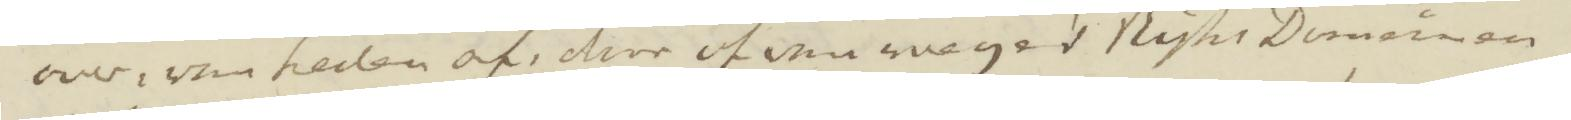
over, van heden af, door of van weges 's Rijks Domeinen
